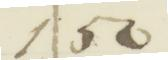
1 50
